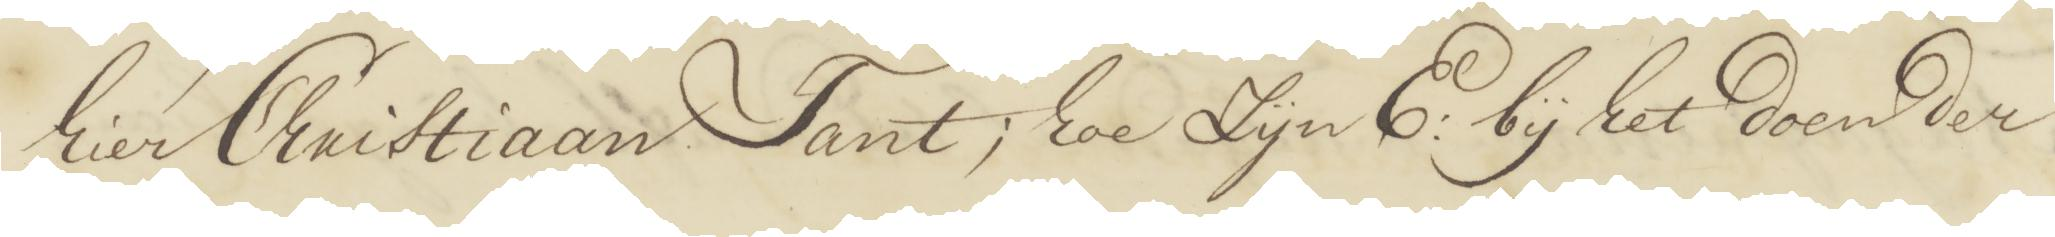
hier Christiaan Tant, hoe zijn E: bij het doen der
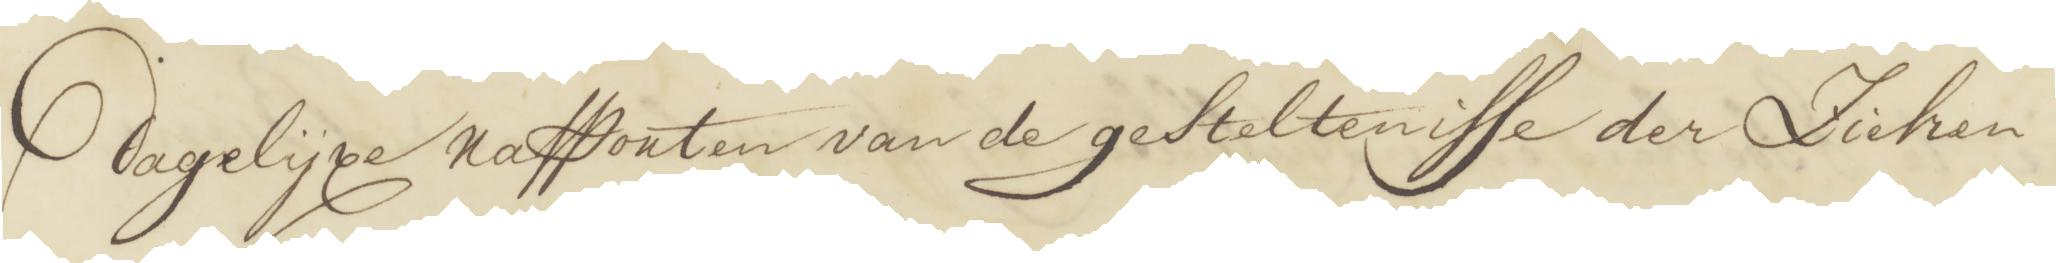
dagelijxe rapporten van de gesteltenisse der Zieken
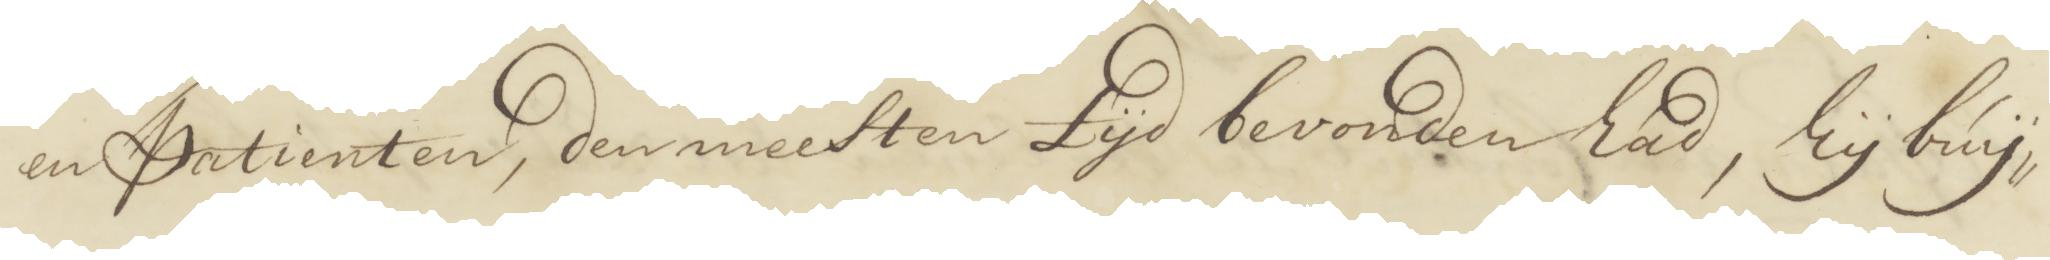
en patienten, den meesten tijd bevonden had, hij buij„
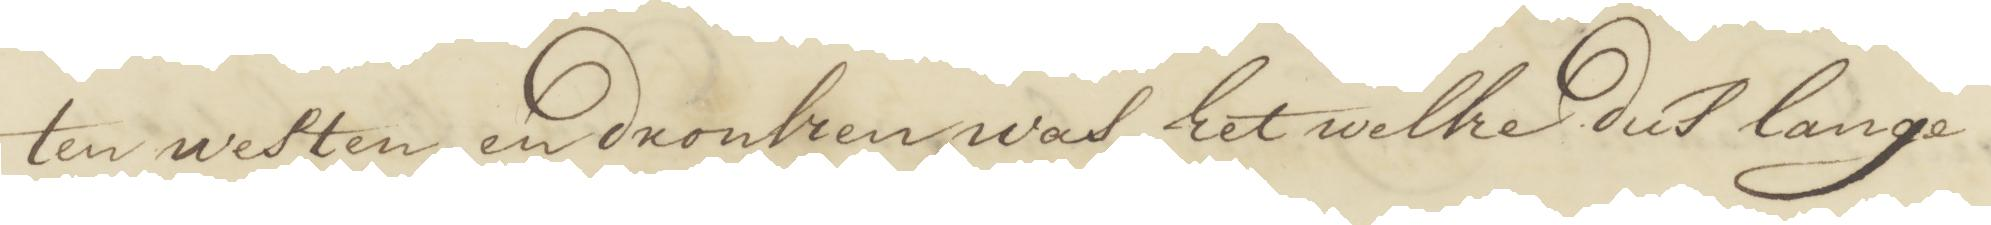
ten westen, en dronken was, het welke dus lange
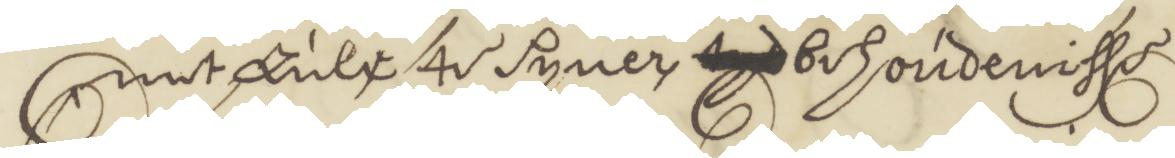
met zulx te syner tyd behoudenisse
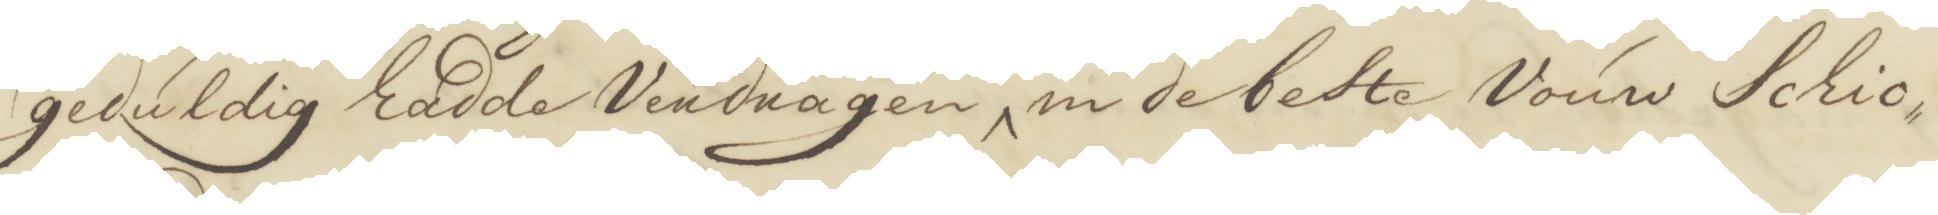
geduldig hadde verdragen ^ in de beste vouw schic„
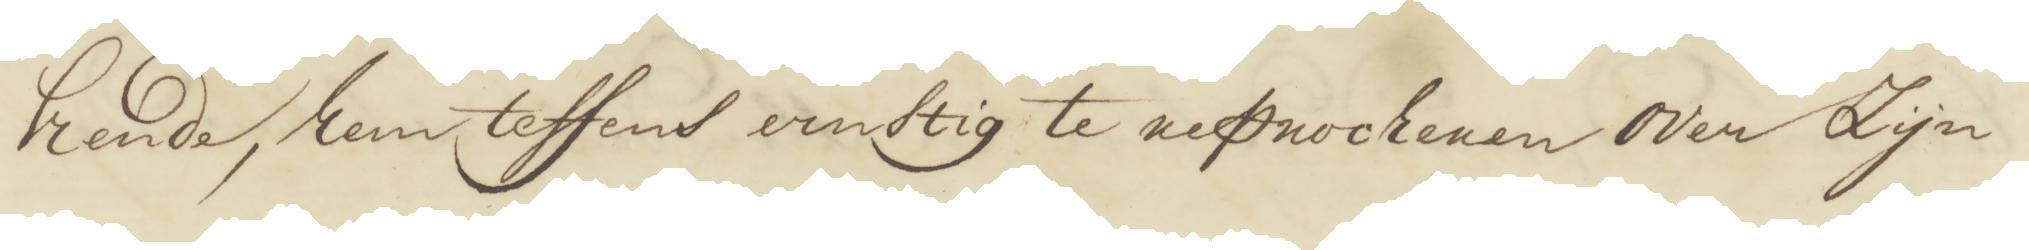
kende, hem teffens ernstig te reprocheren over zijn
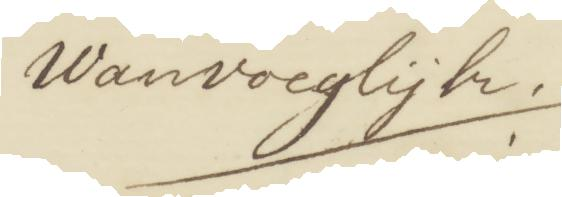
wanvoeglijk./.
